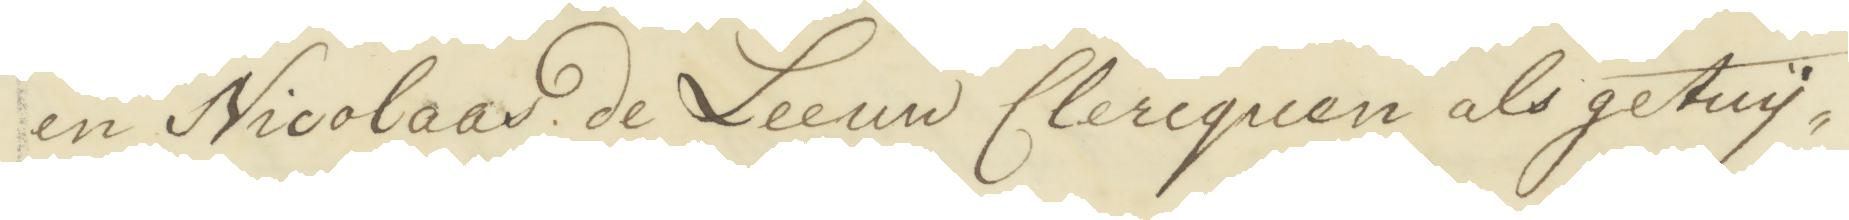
en Nicolaas de Leeuw Clercquen als getuij„
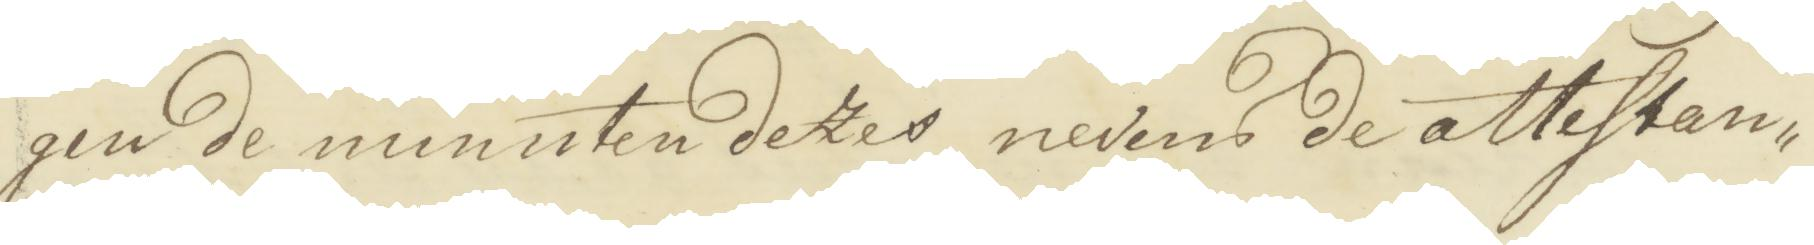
gen de minuten dezes nevens de attestan„
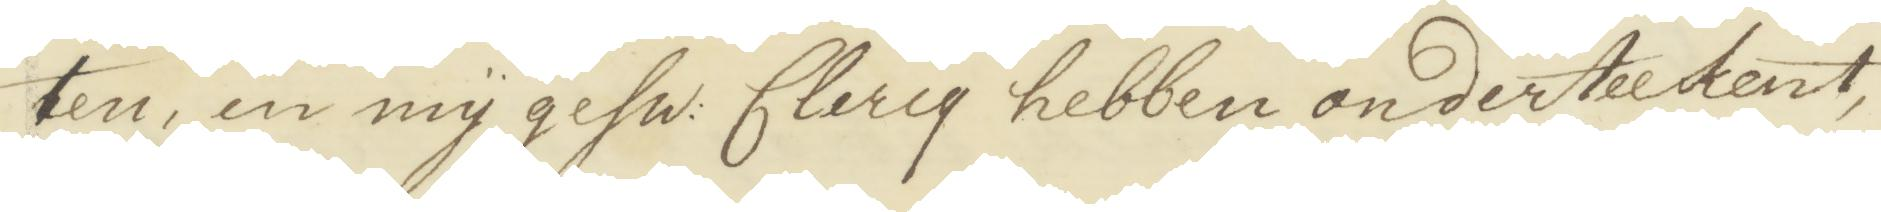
ten, en mij gesw: Clercq hebben onderteekent,
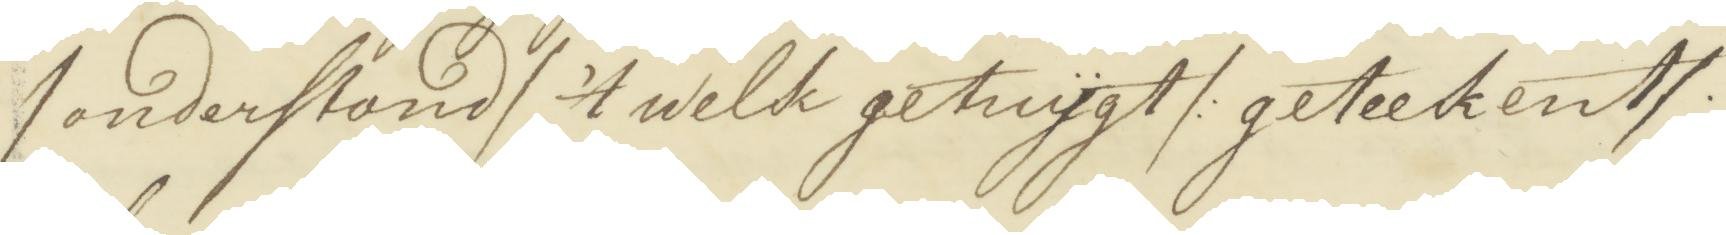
/ onderstond/ ’t welk getuijgt /: geteekent/.
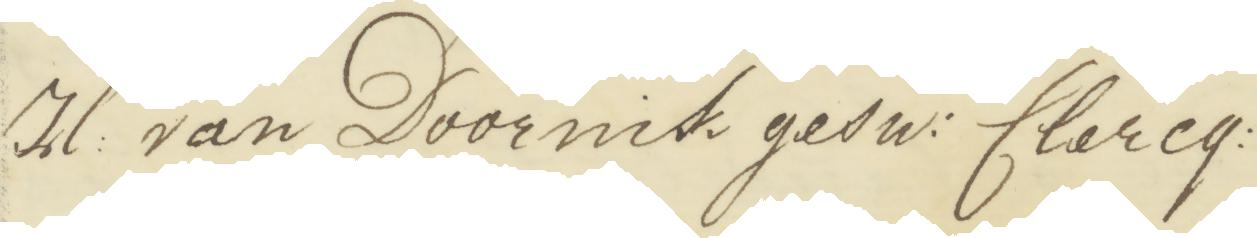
H: van Doornik gesw: Clercq:
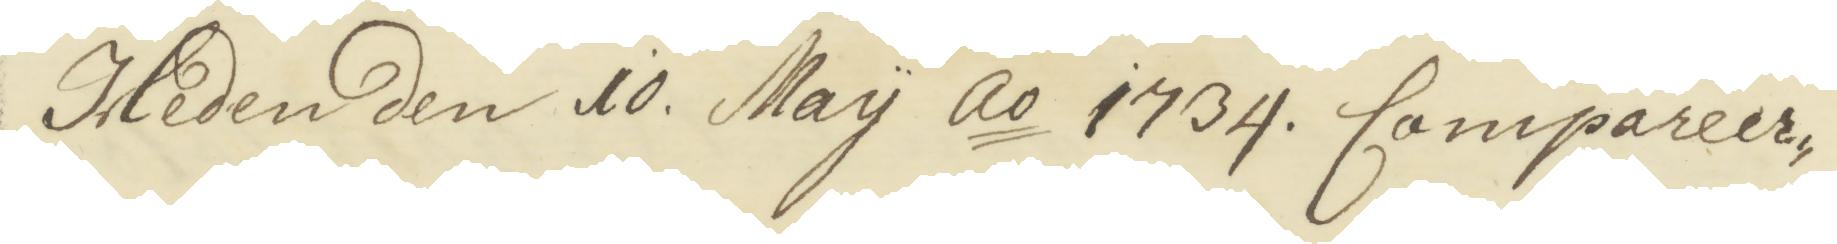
Heden den 10. Maij A=o 1734. Compareer„
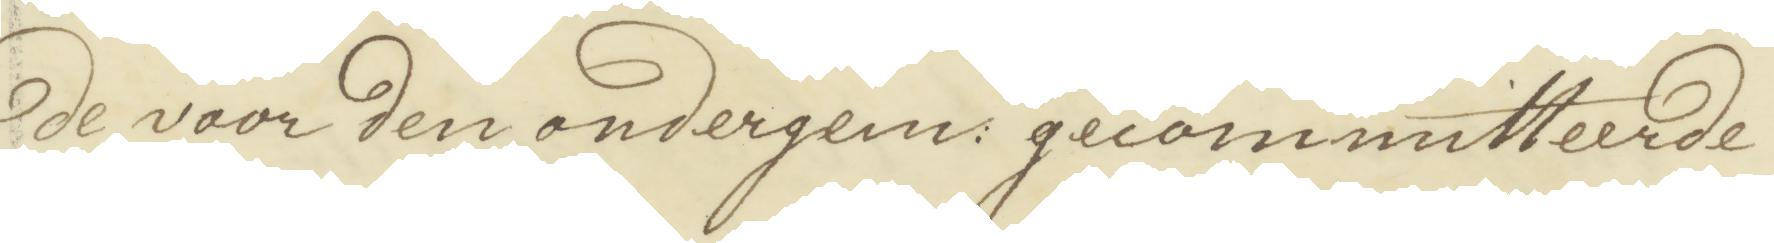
de voor den ondergem: gecommitteerde
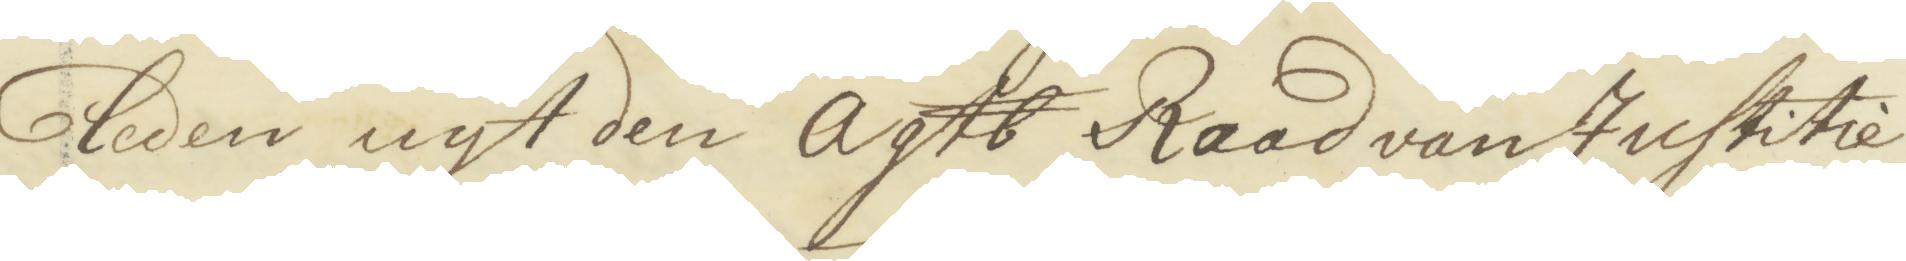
leden uijt den Agtb Raad van Justitie
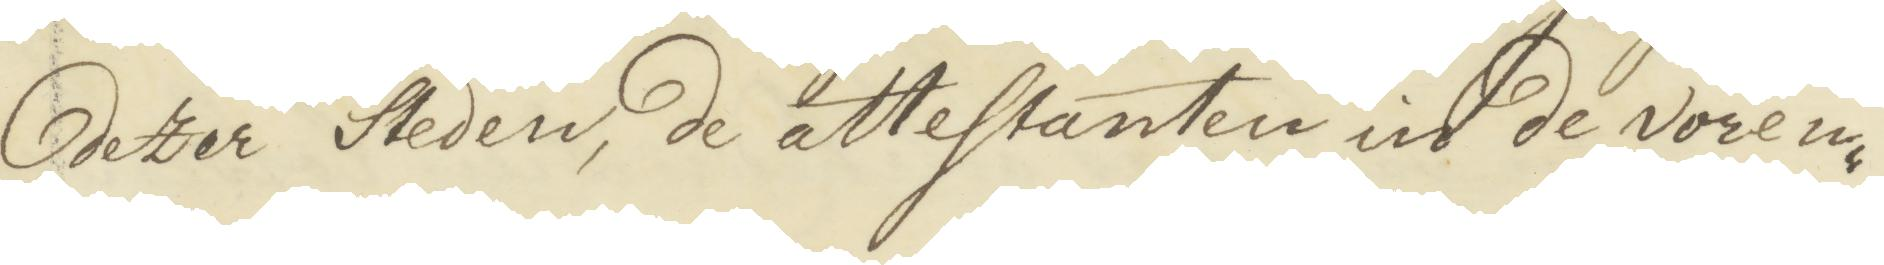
dezer Steden, de attestanten in de voren„
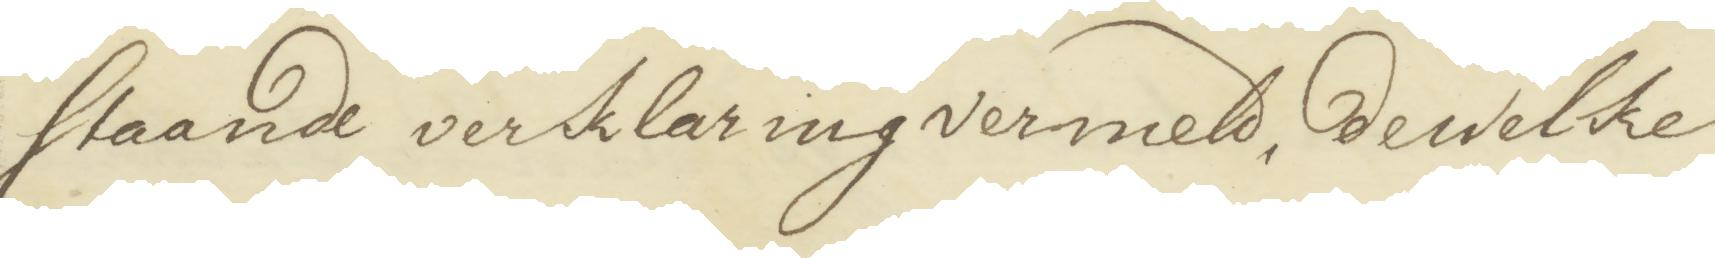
Staande verklaring vermeld, dewelke
